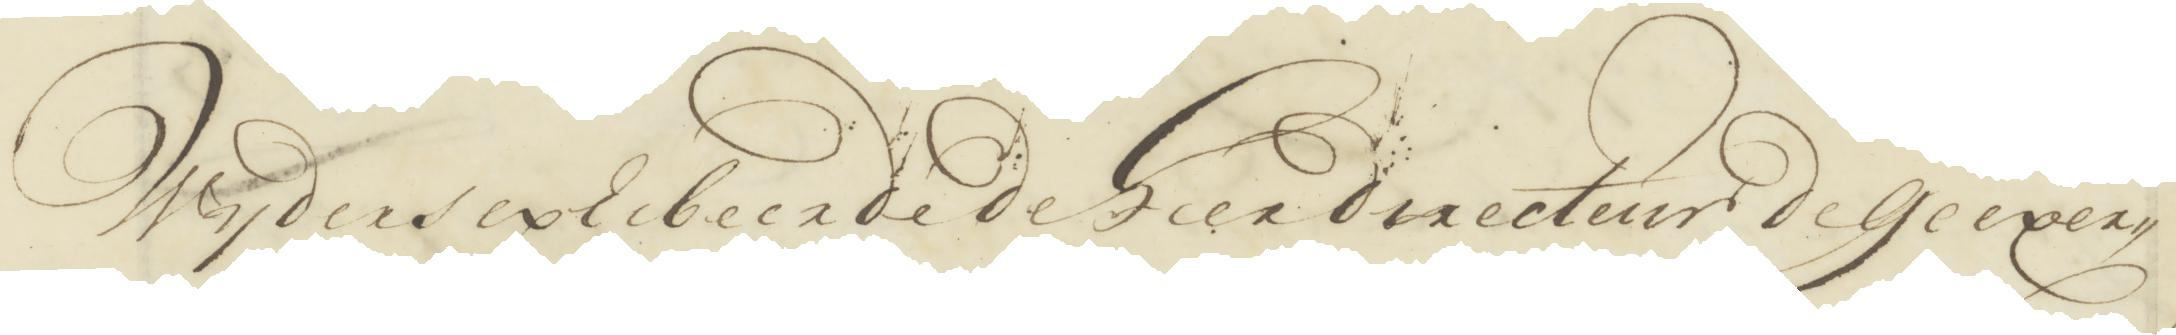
Wyders exhibeerde de Heer directeur de geexer„
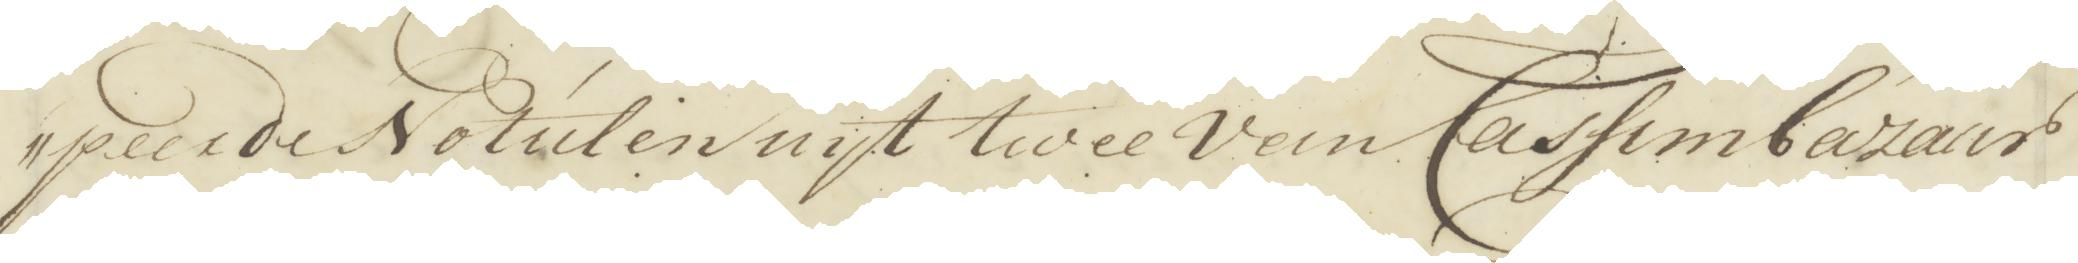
„peerde Notulen uyt twee van Cassimbazaar
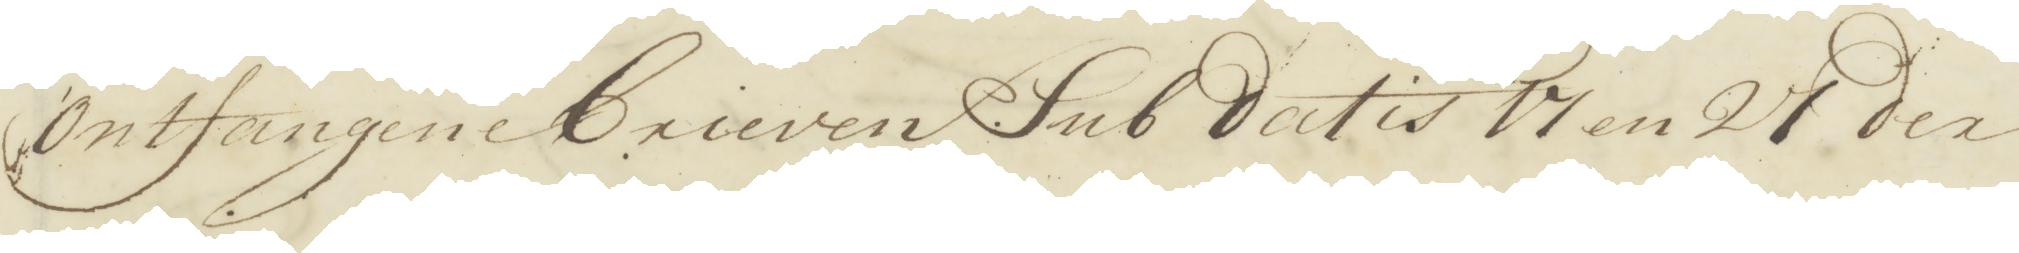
Ontfangene brieven Sub datis 17 en 27 der
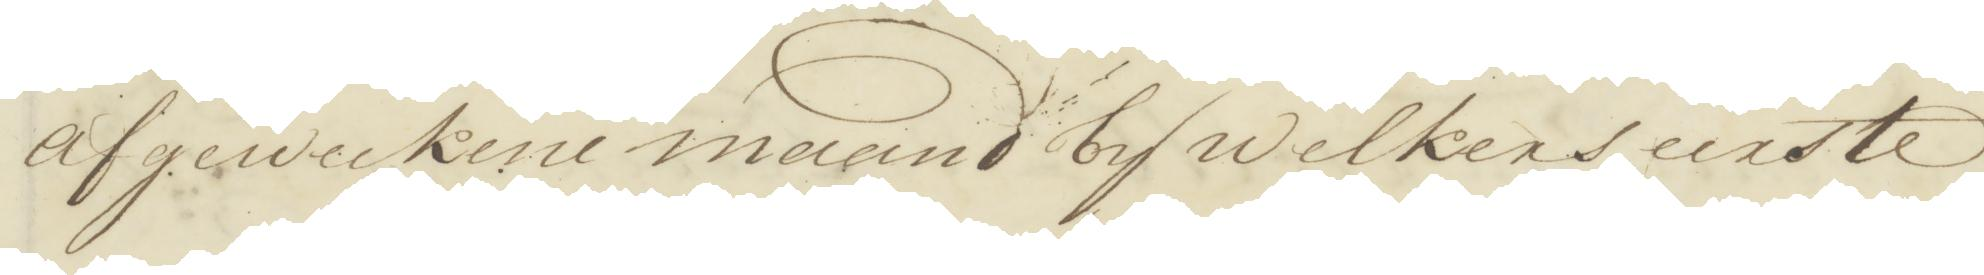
afgeweekene maand by welkers eerste
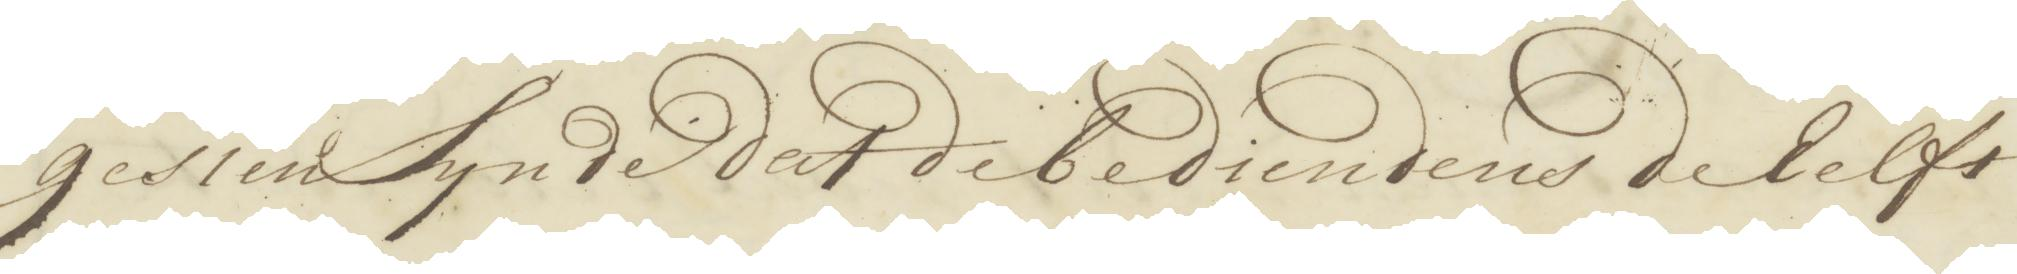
gesien Synde dat de bediendens de helft
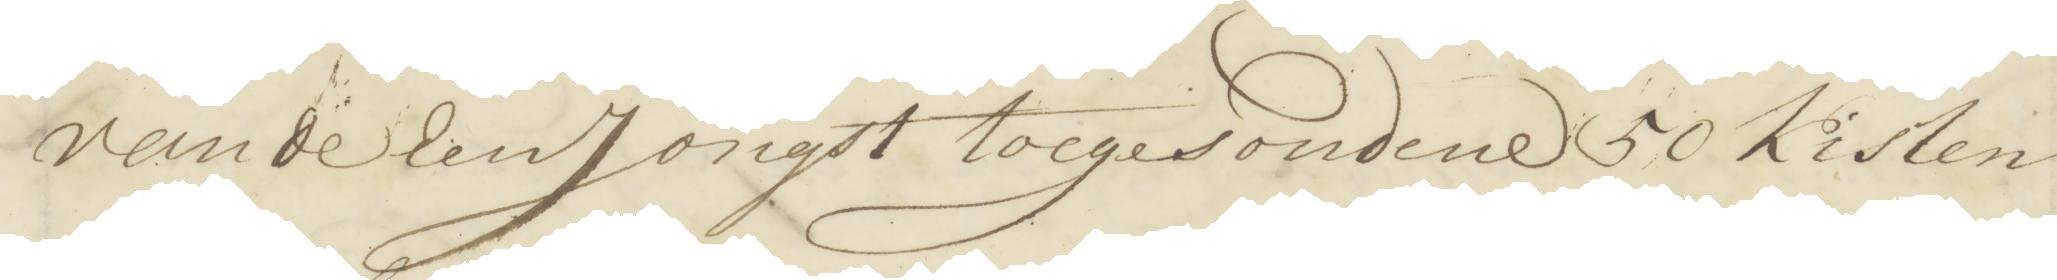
van de Een Jongst toegesondene 50 kisten
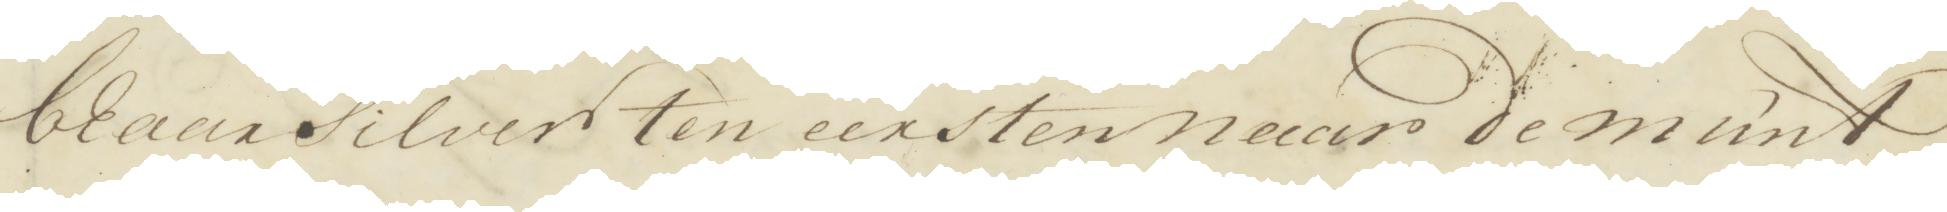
bhaar Silver ten eersten naar de munt
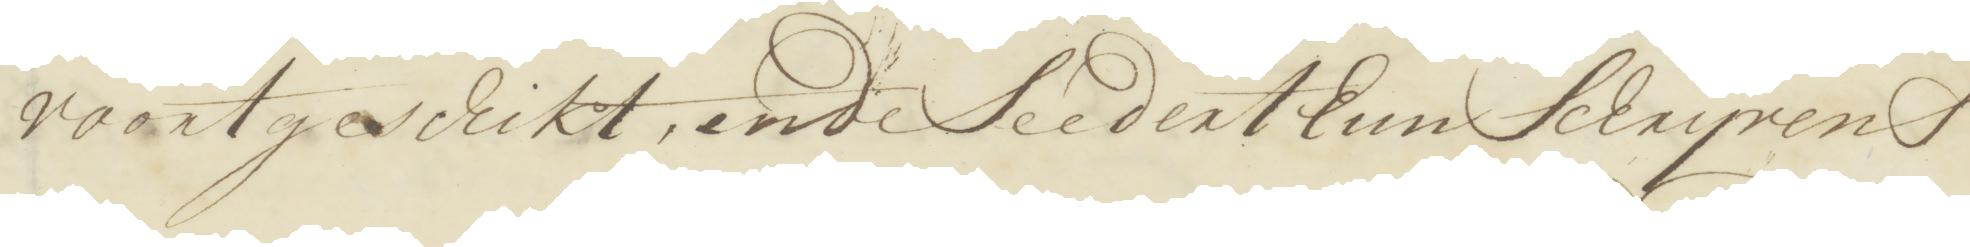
voortgschikt, ende Seedert hun Schryvens
